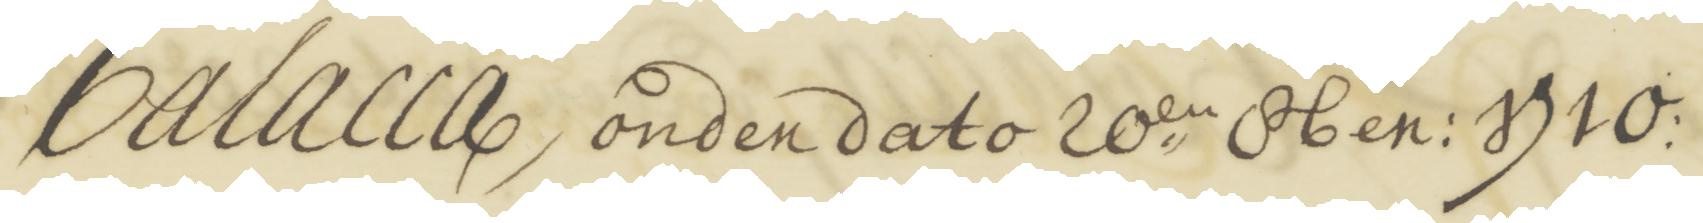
Malacca, onder dato 20„en 8ber: 1710:
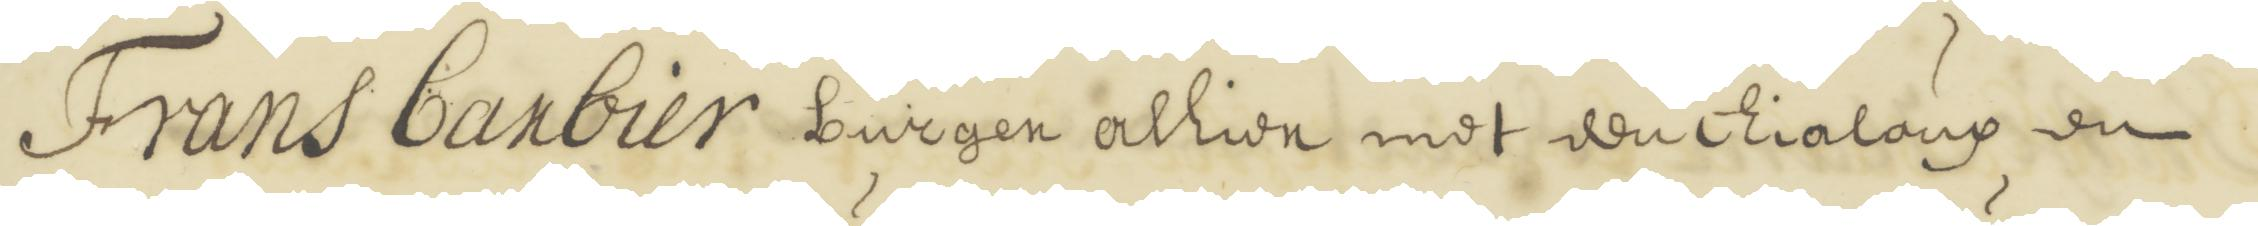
Frans barbier burger alhier met een chialoup en
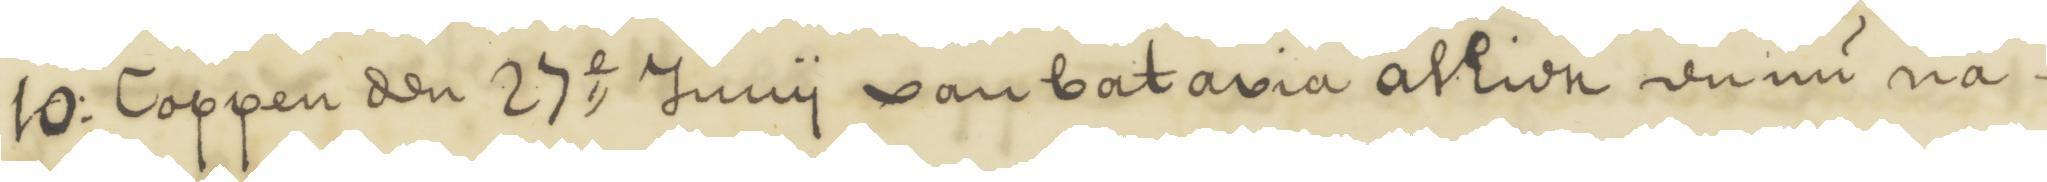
10: Coppen den 27„e Junij van batavia alhier en nu na
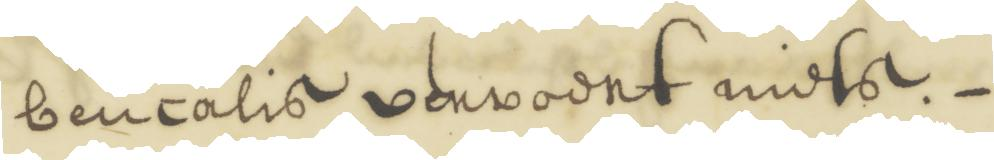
bencalis vervoert niets. —
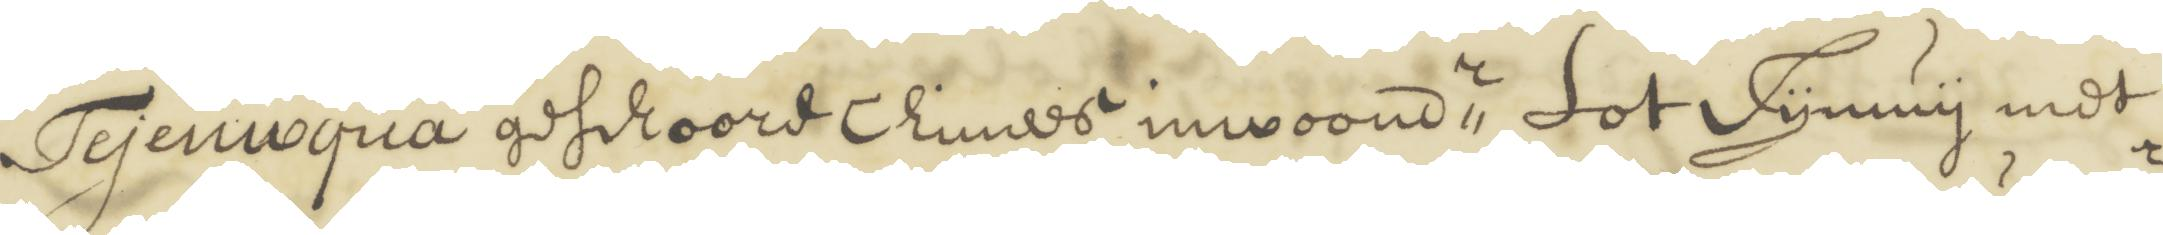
Tejeuwqua geschoore Chinees inwoond„r tot sijmuij met
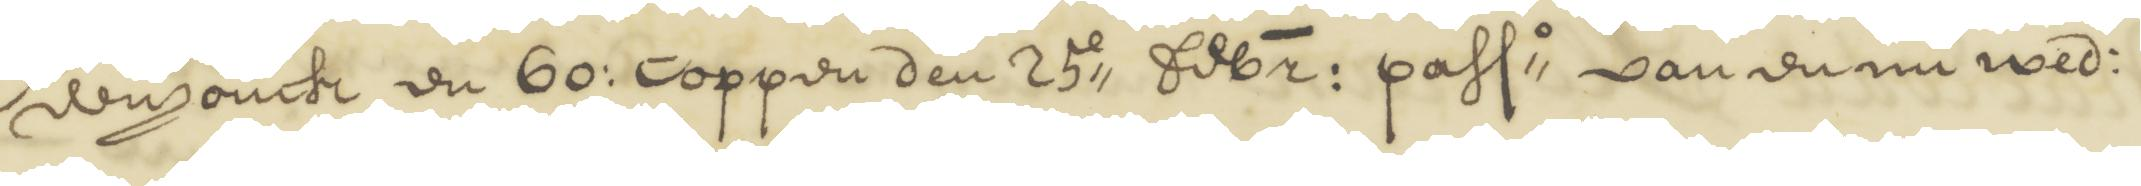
een jonck en 60: Coppen den 25„e febr: pass„o van en nu wed:r
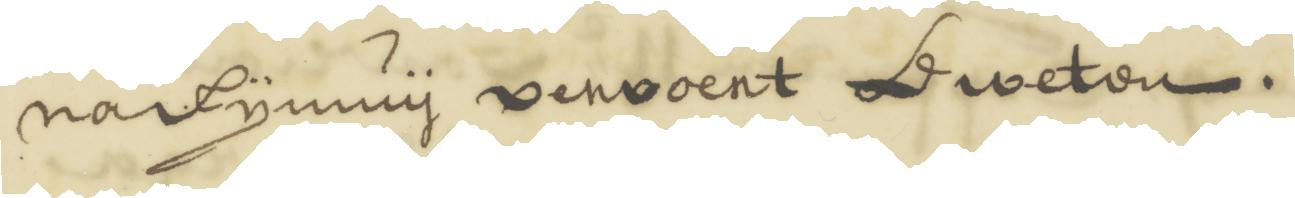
na Sijmuij vervoert te weten.
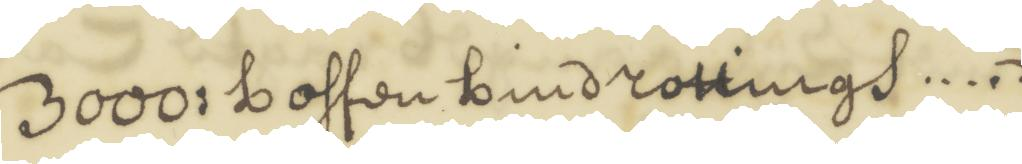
3000: bossen bindrottings . . . .
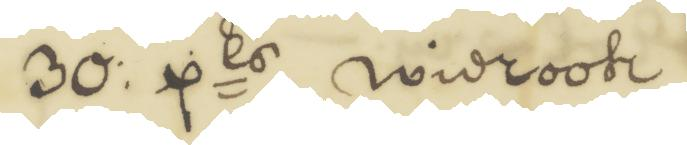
30: p=ls wierook
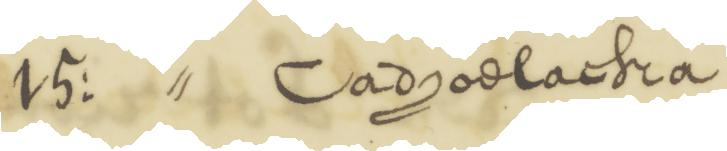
15: „ Cadjoelacka
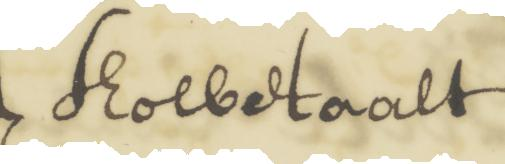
thol betaalt
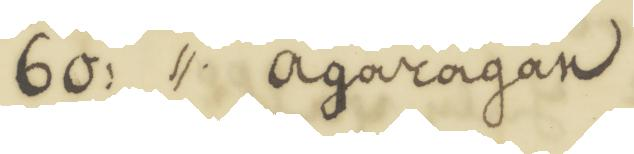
60: „ . agaragar
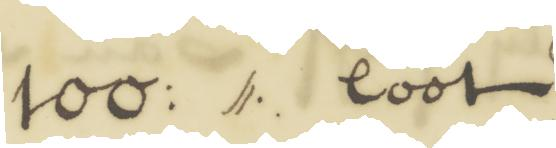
100: „ . loot
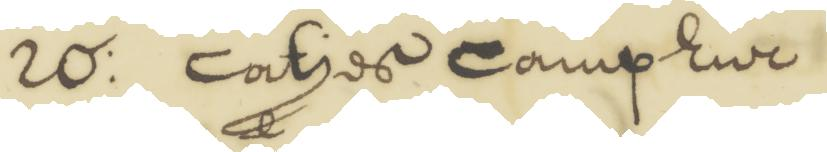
20: catjes Camphur
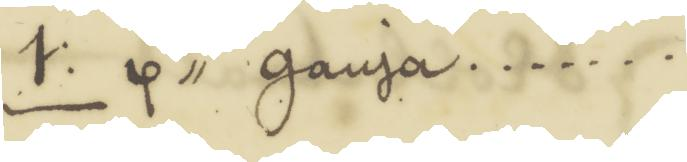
1: p„l ganja . . . . . . .
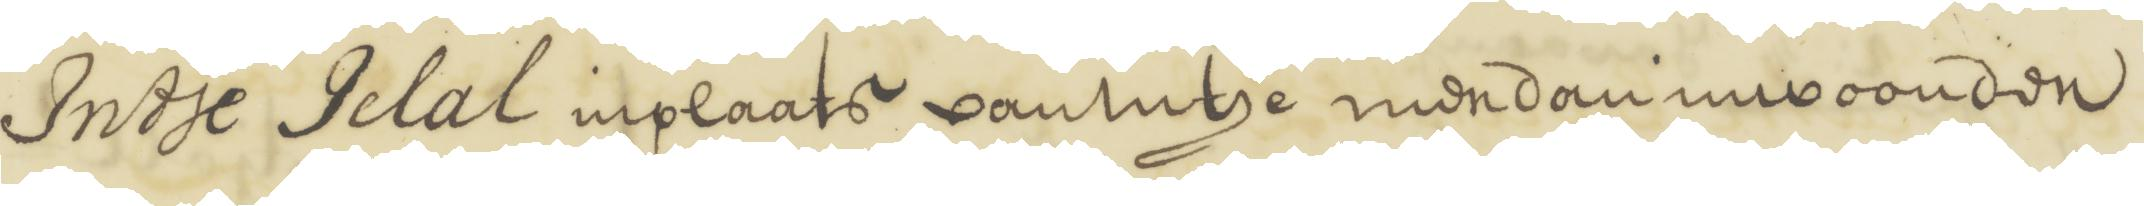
Intje Selal in plaats van intje mer dan inwoonder
